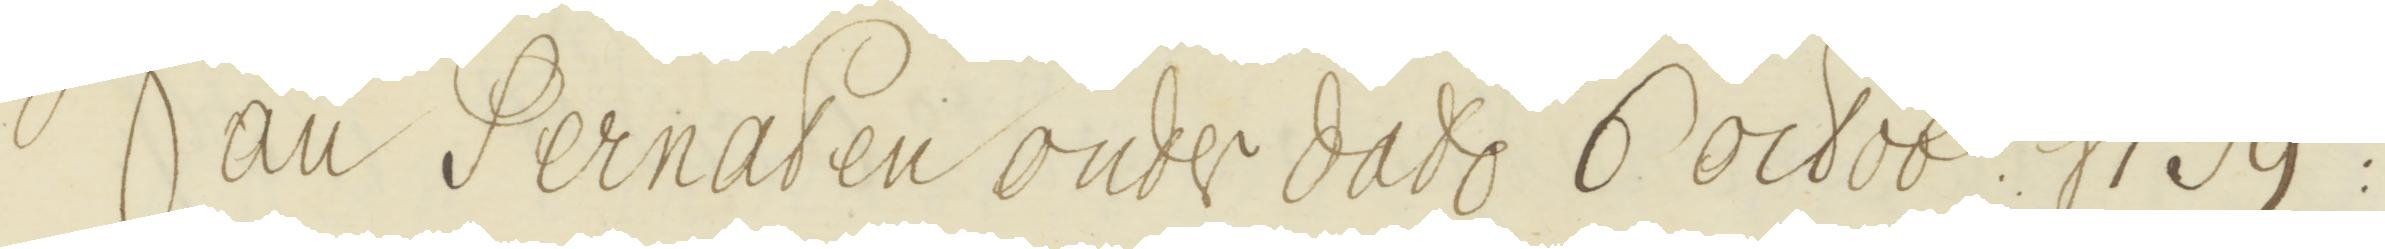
Van Ternaten onder dato 6 octob: 1739:
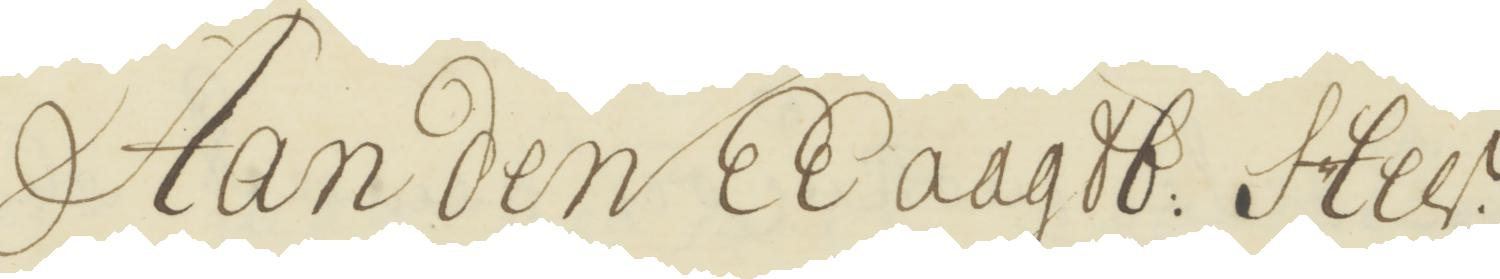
Aan den EE aagtb: Heer:
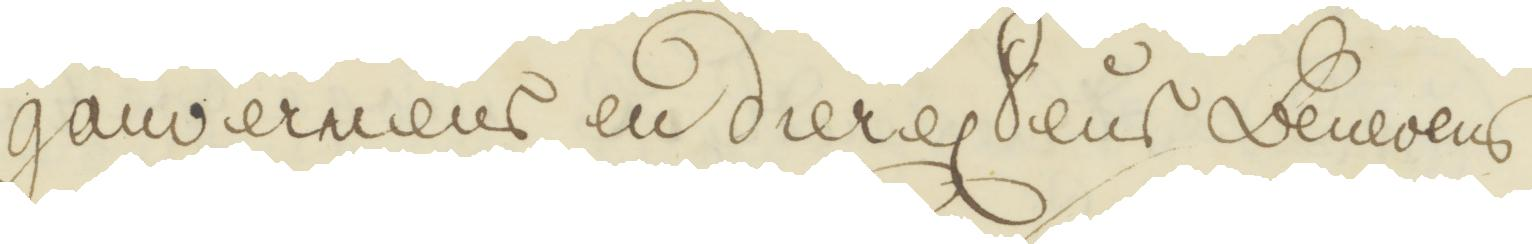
gouverneur en dierecteur benevens
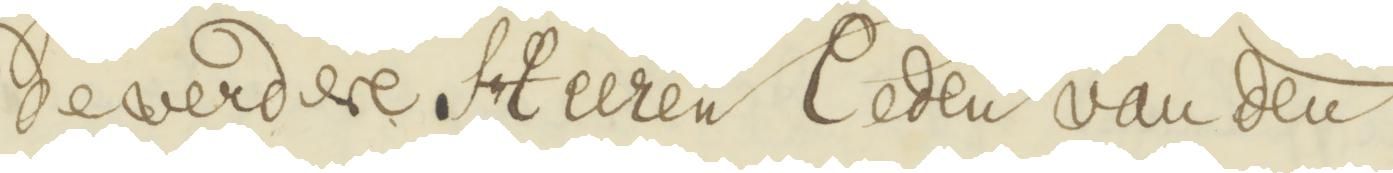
de verdere Heeren Leden van den
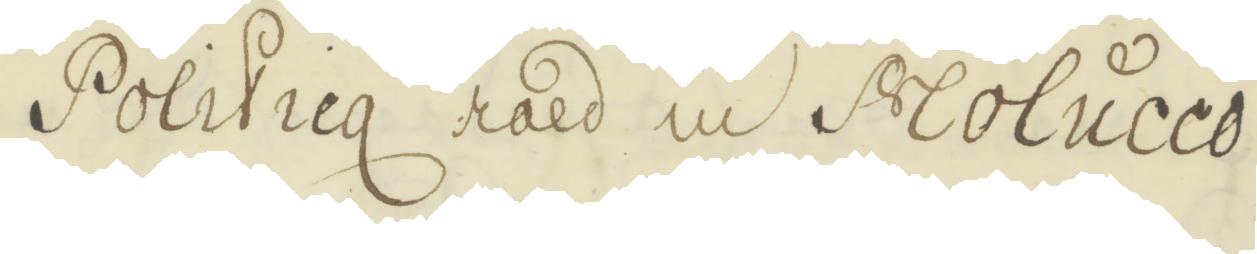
Politieq raed in Molucco
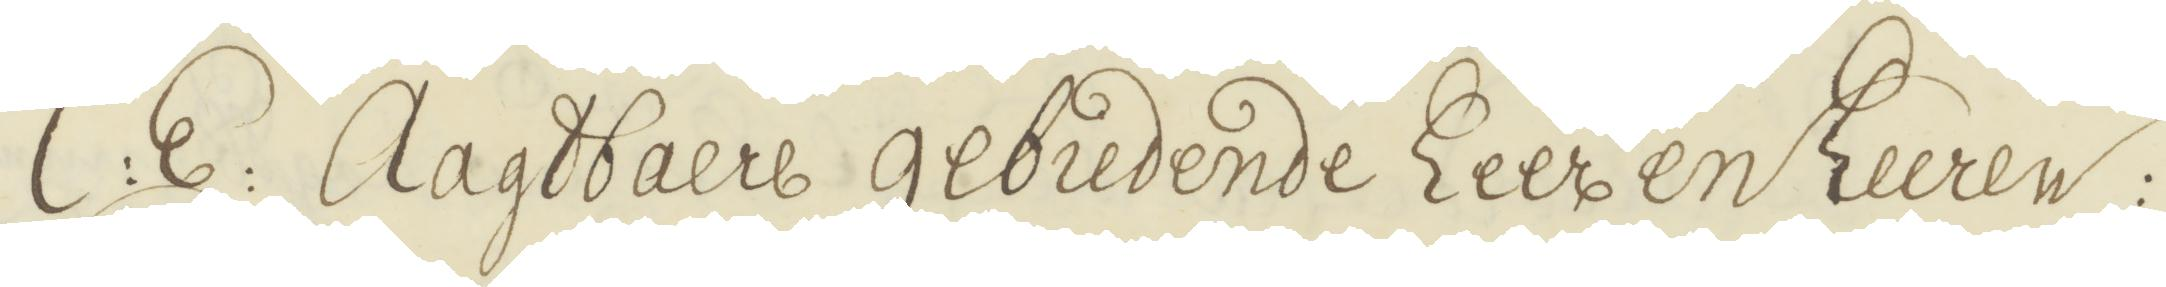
E: E: Aagtbaere gebiedende heer en heeren:
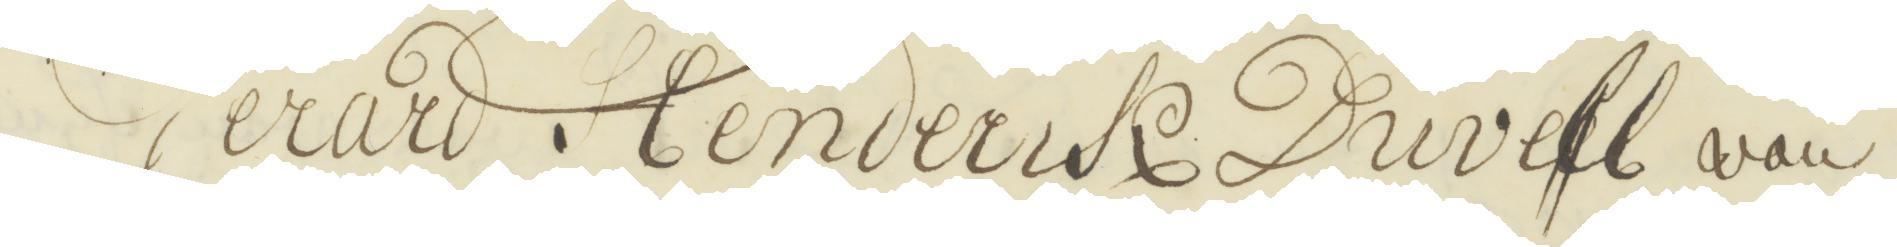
Gerard Henderik Duvell van
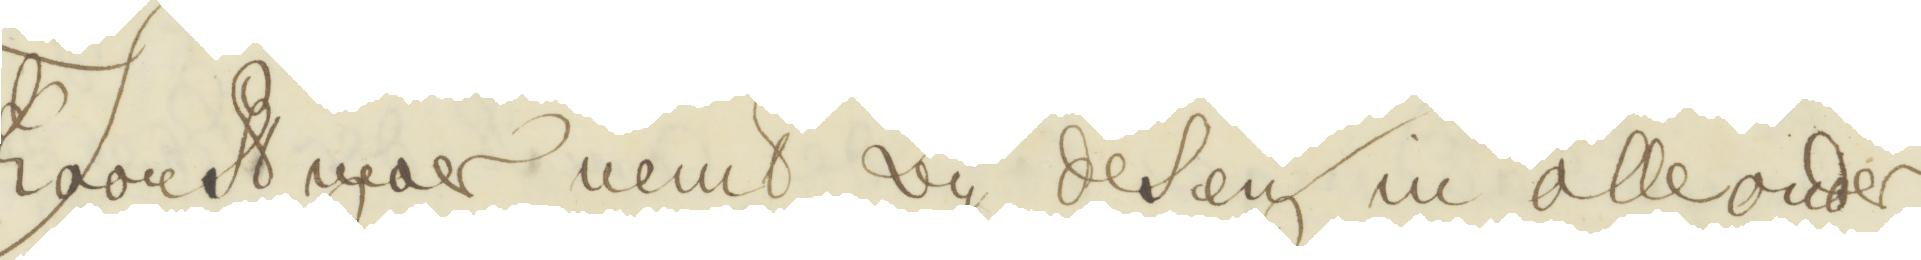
hoorst maer nemt bij desen in alle onder
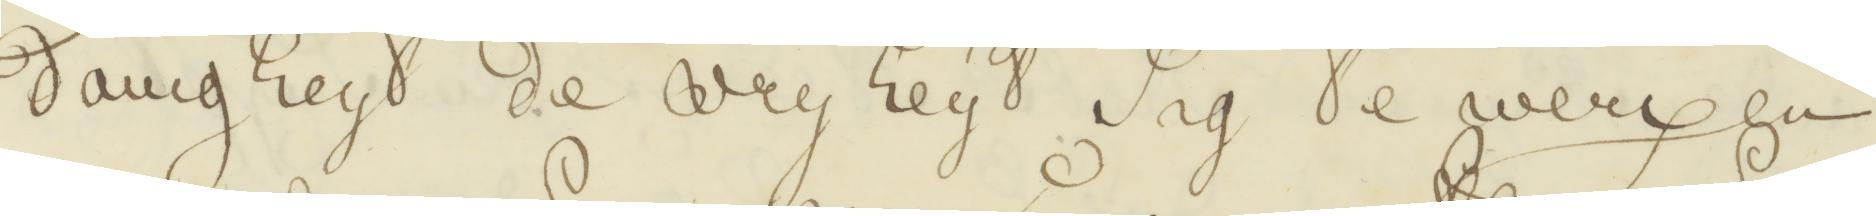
danigheijt de vrij heijt Sig te werpen
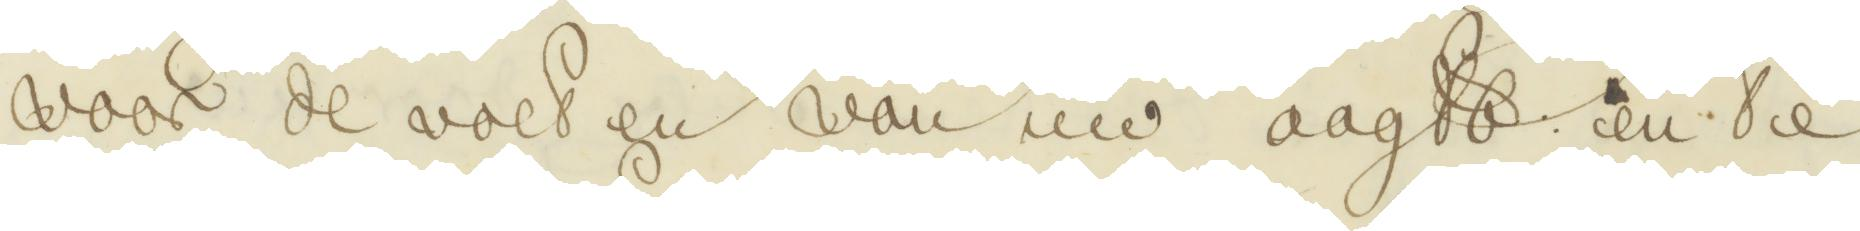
voor de voeten van uw aagtb: en te
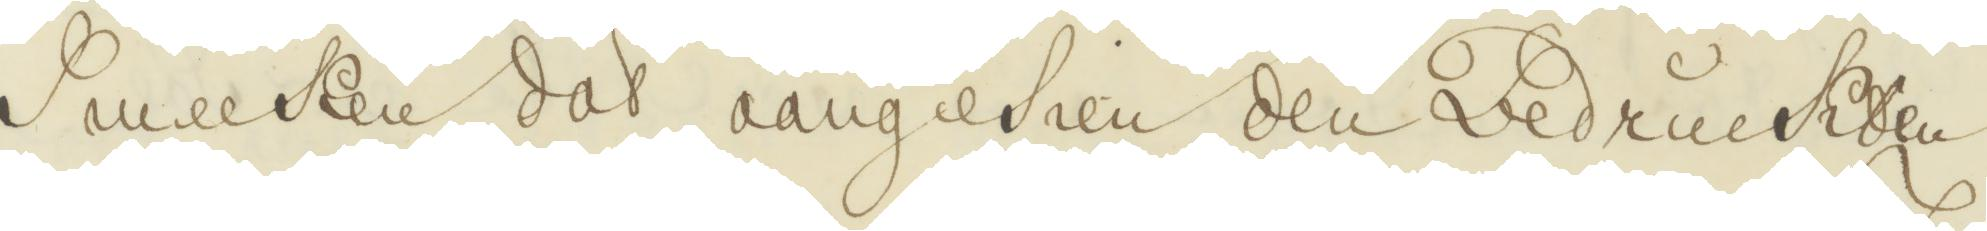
Smeeken dat aangesien den bedruekten
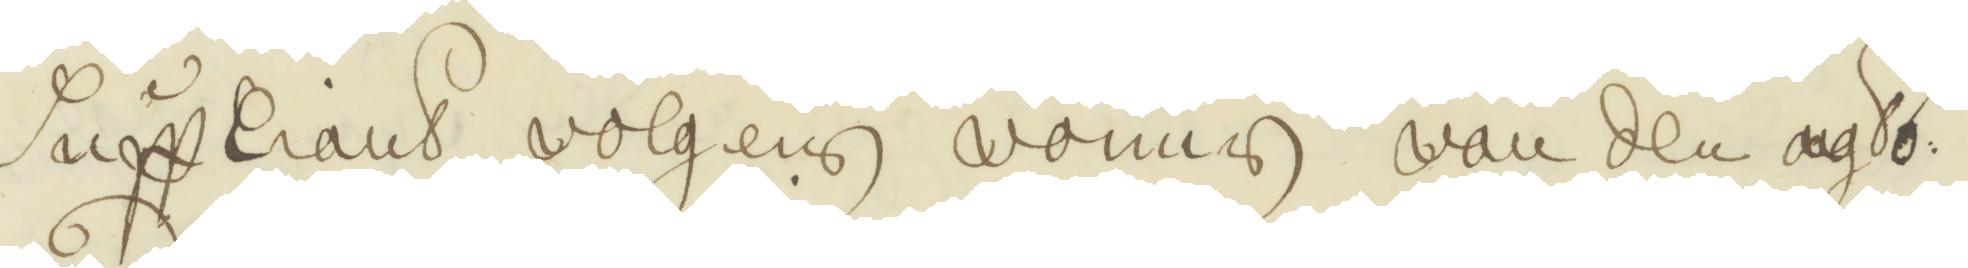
Suppliant volgens vonnis van den agtb:
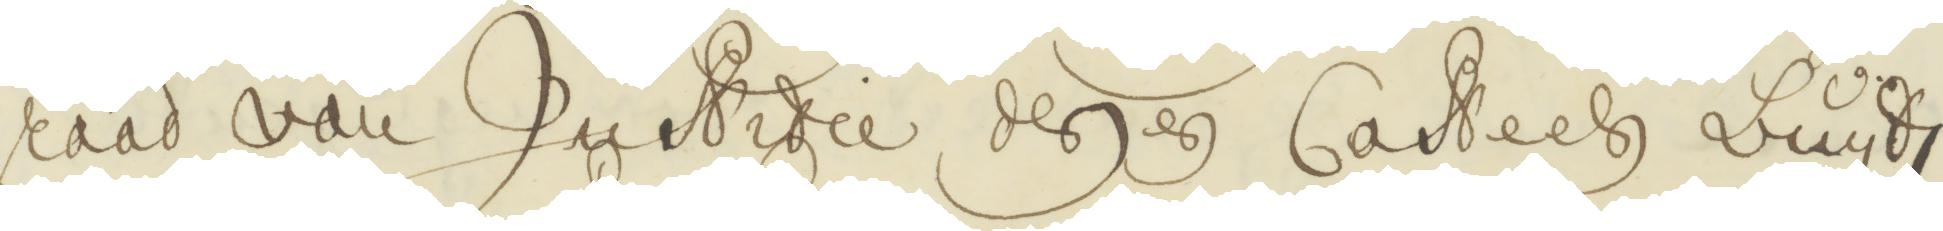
raad van Justitie deses Casteels buijten
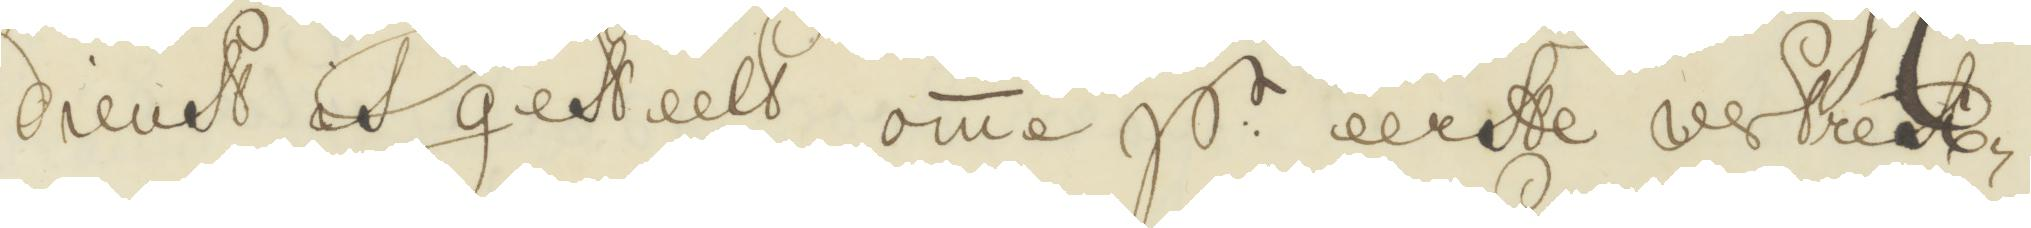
dienst is gesteelt ome p:r eerste verstrek„
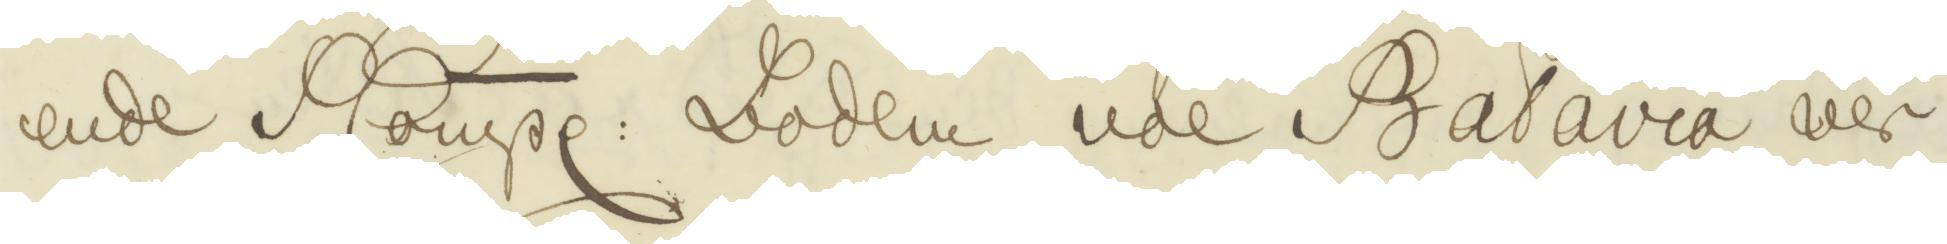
ende SComps: bodem nae Batavia ver
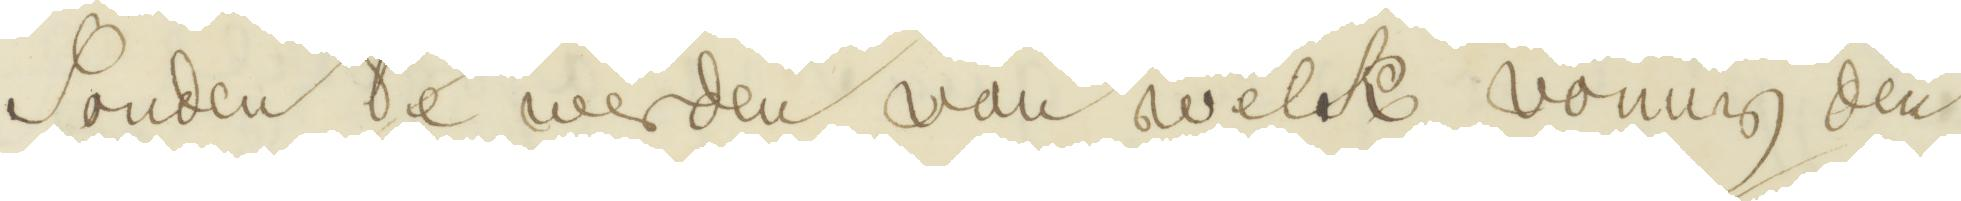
sonden te werden van welk vonnis den
